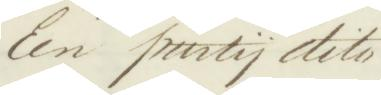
Een partij dito
